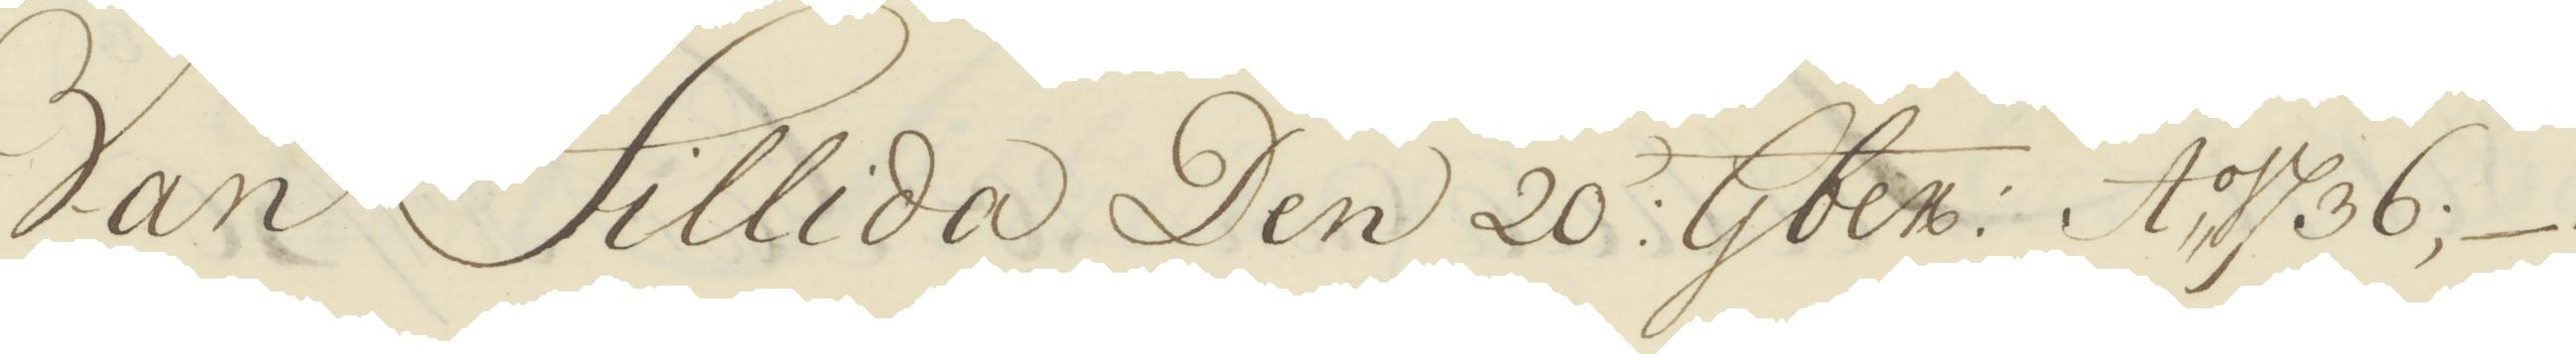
Van Sillida Den 20:' 9ber: A„o 1736;— .
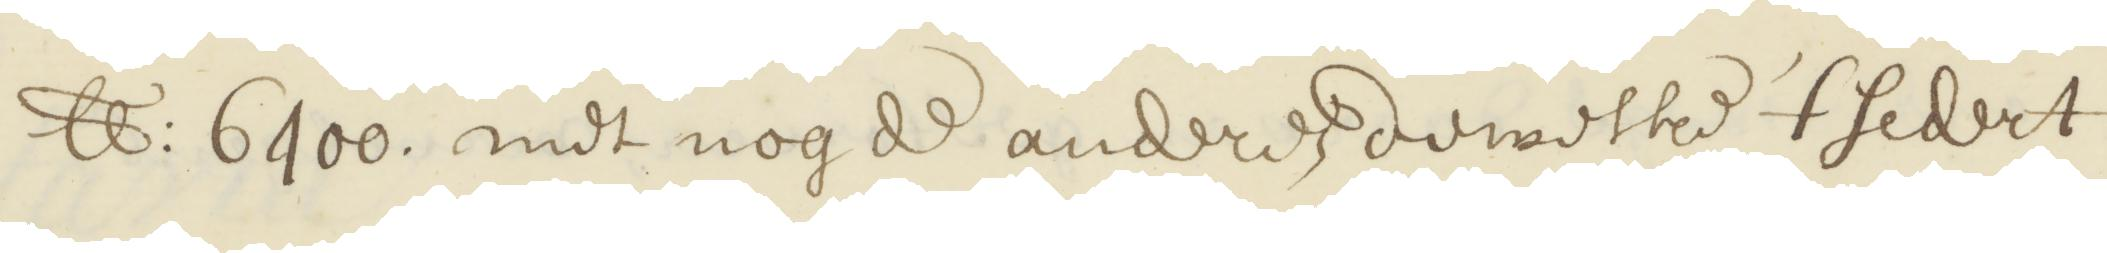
lb: 6400. met nog de anderen dewelke 'tsedert
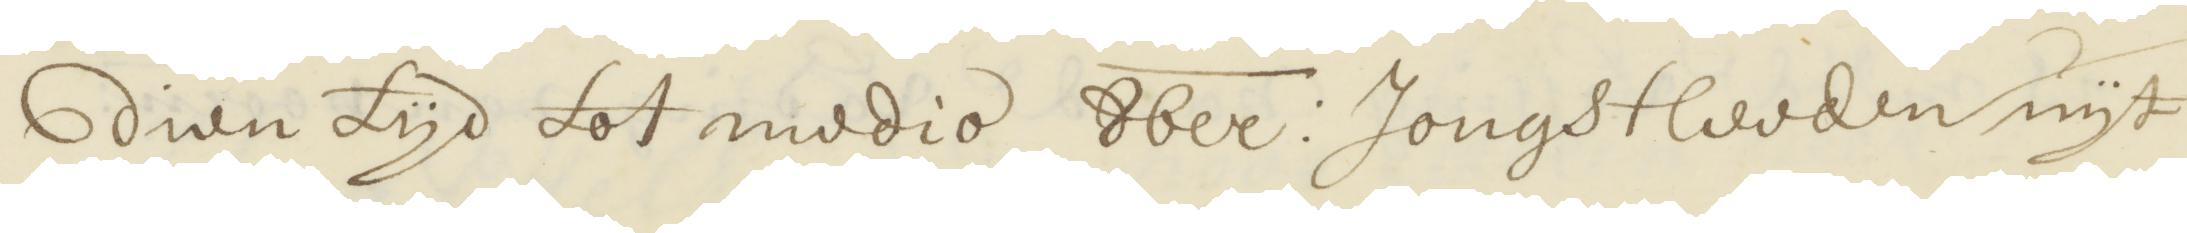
dien tijd tot medio 8ber: Jongstleeden uijt
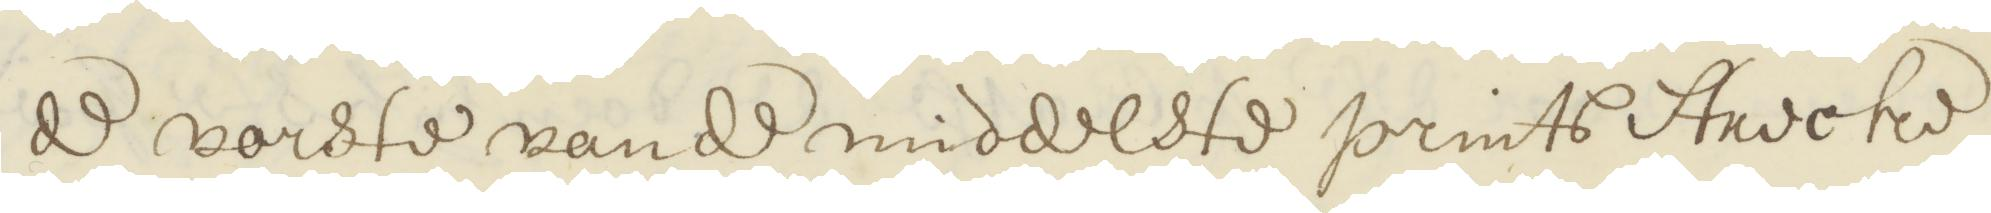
de vorste van de middelste prints strecke
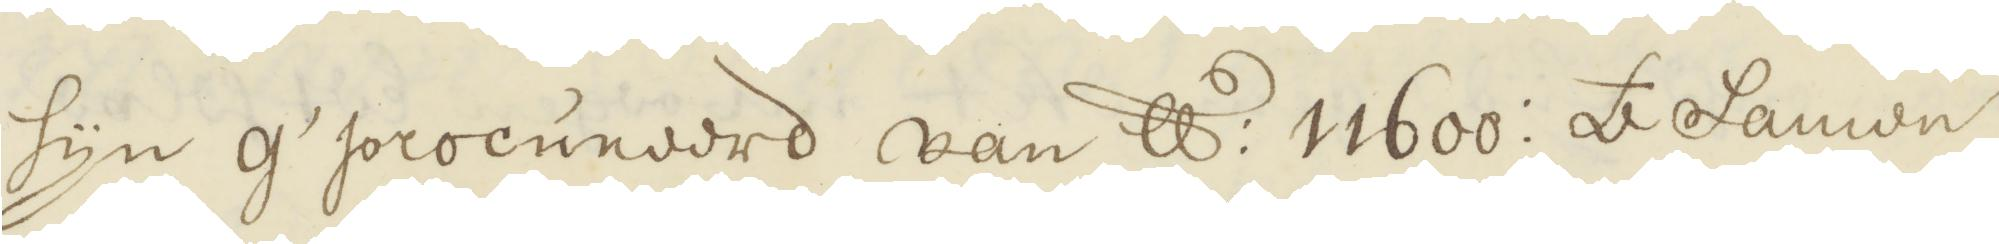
sijn g’procureerd van lb: 11600: te samen
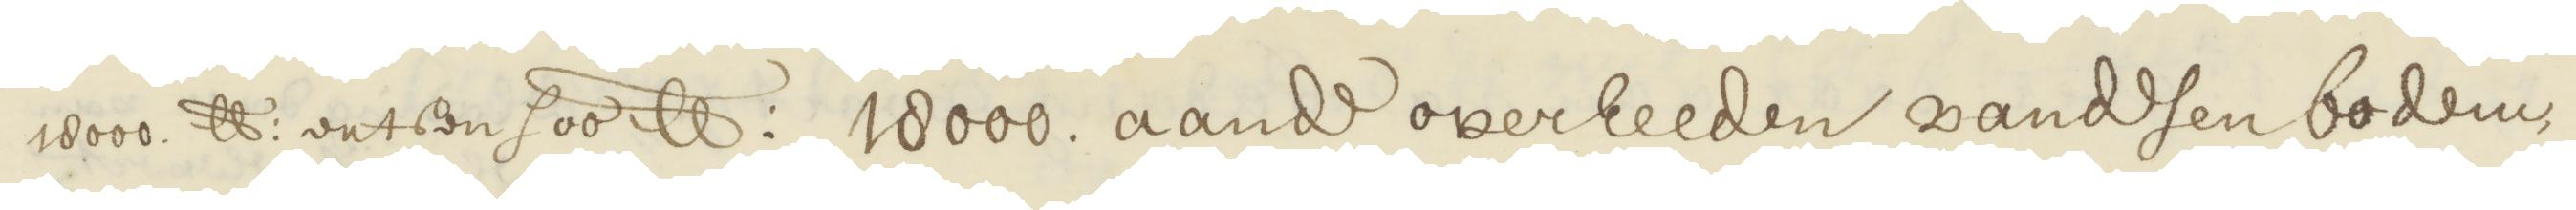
18000. lb: ertsen soo lb: 18000. aan de overheeden van desen bodem,
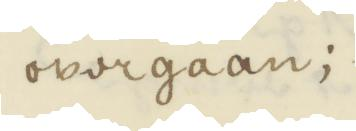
overgaan;
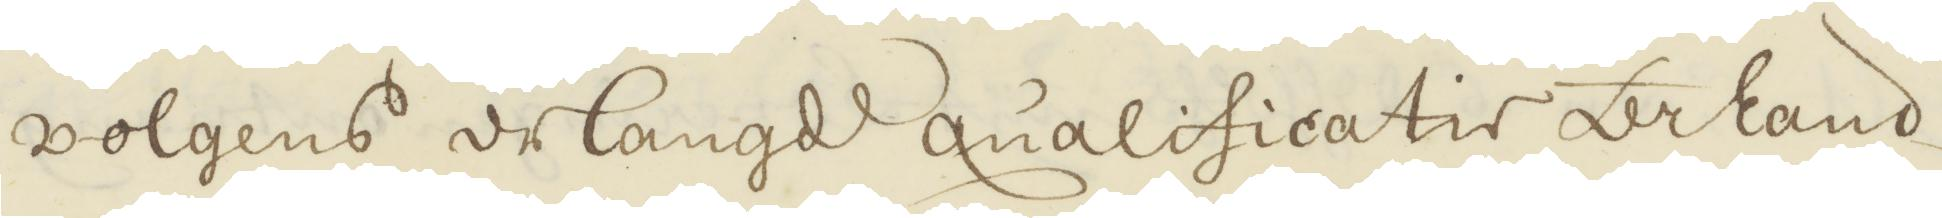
volgens erlangde qualificatie ter hand
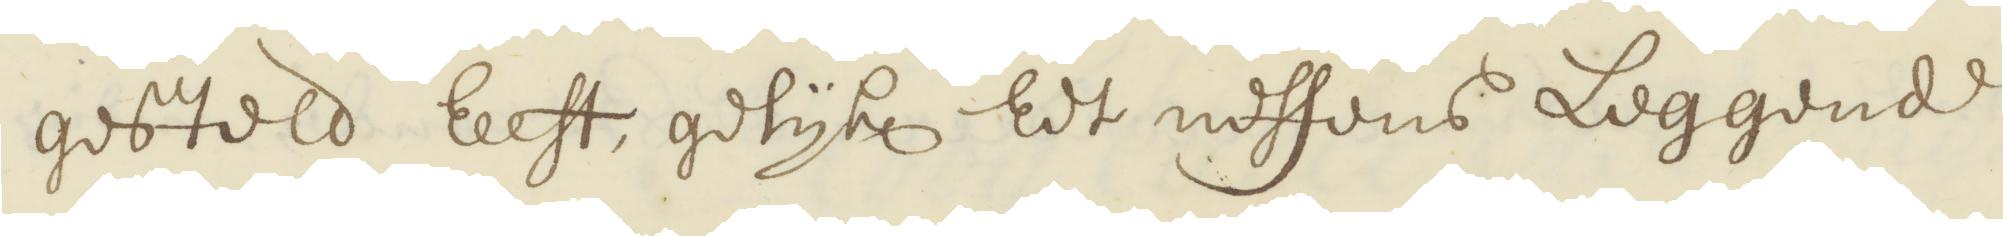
gesteld heeft, gelijk het neffens zeggende
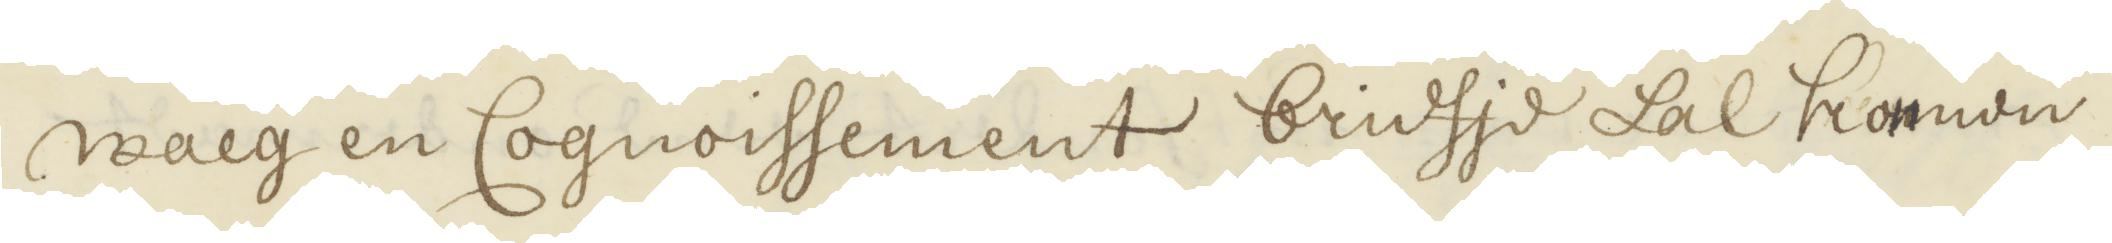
waeg en Cognoissement briefje zal komen
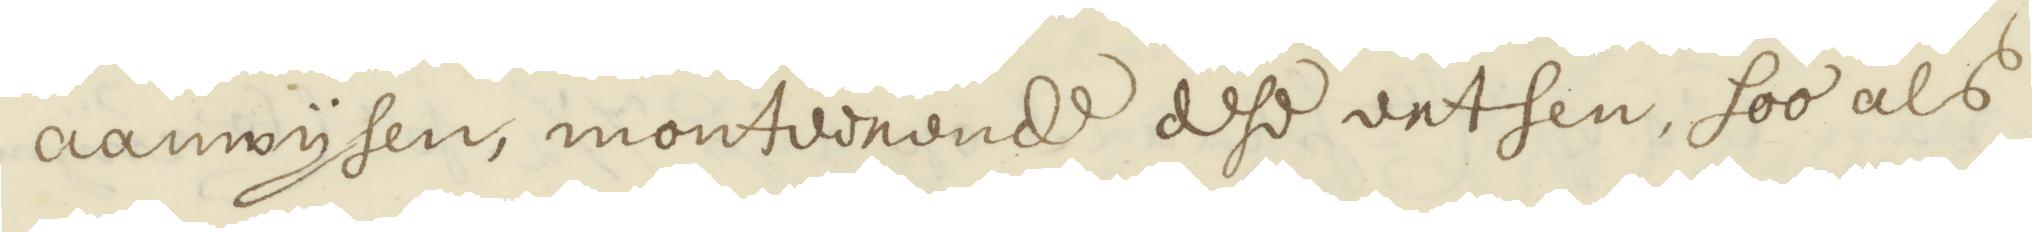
aanwijsen, monteerende dese ertsen, soo als
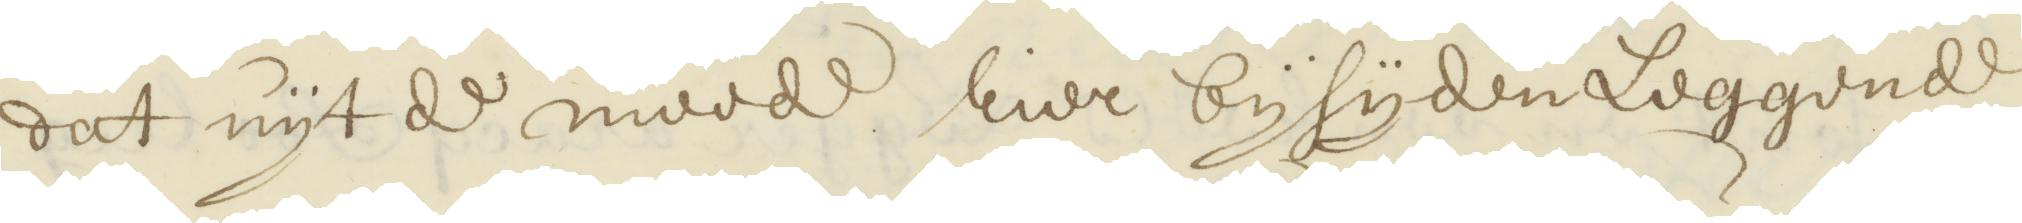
dat uijt de meede hier bijsijden zeggende
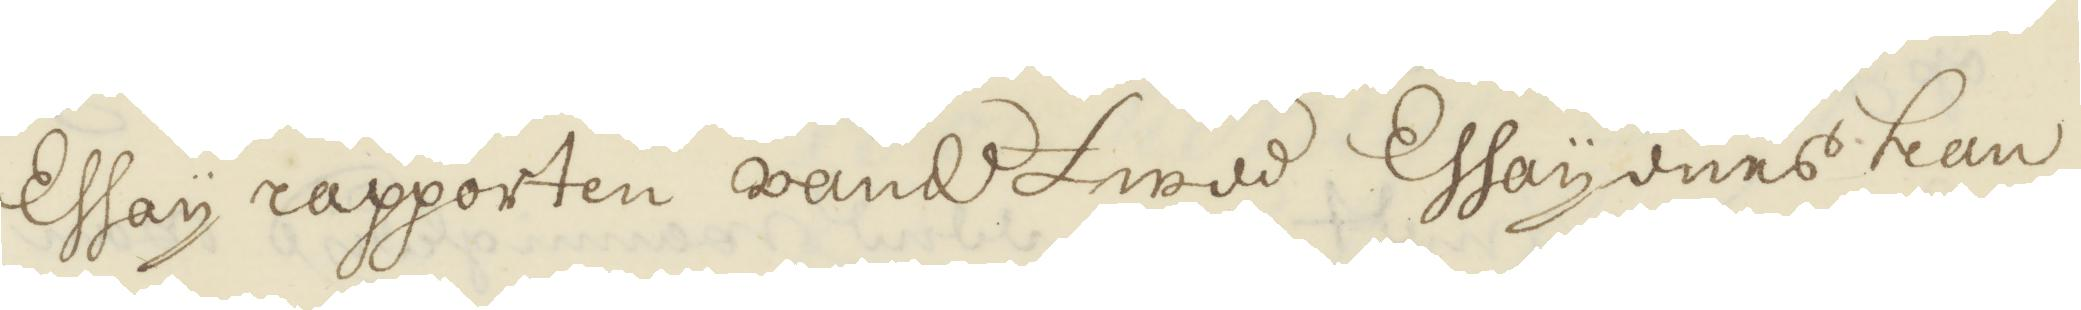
Essaij rapporten vande twee Essaijeurs kan
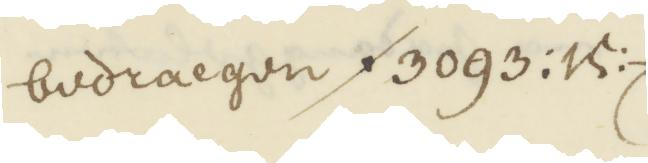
bedraegen ƒ3093:15:–:
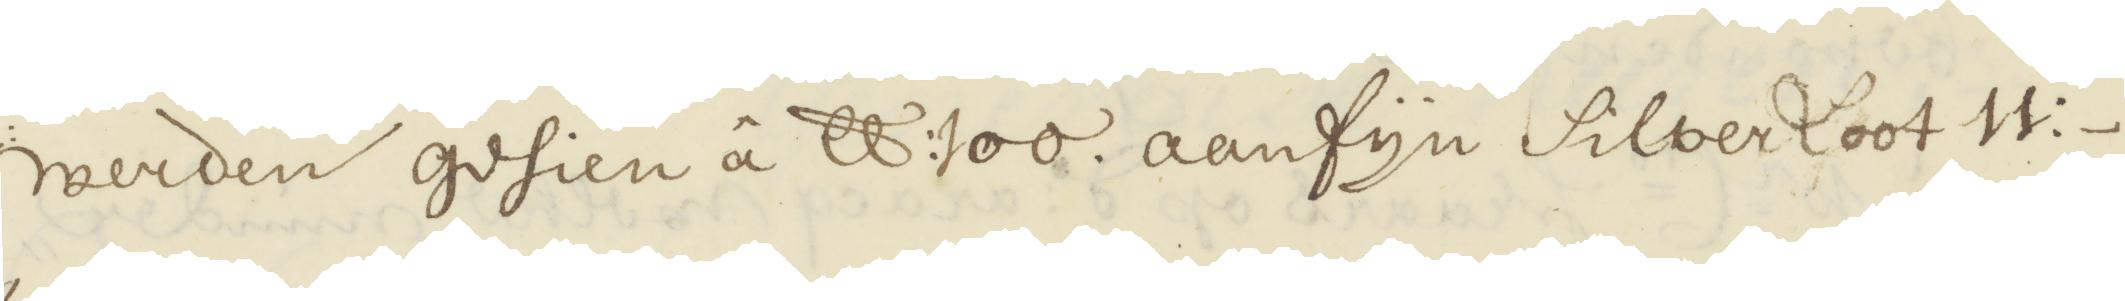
werden gesien â lb: 100. aanfijn silverloot 11:–
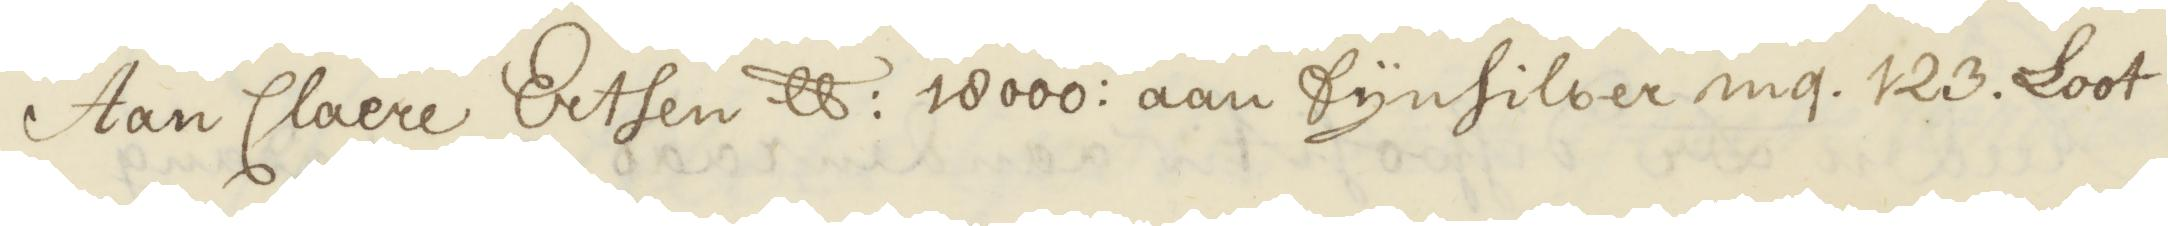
Aan Claere Ertsen lb: 18000: aan fijnsilver mq. 123. loot
